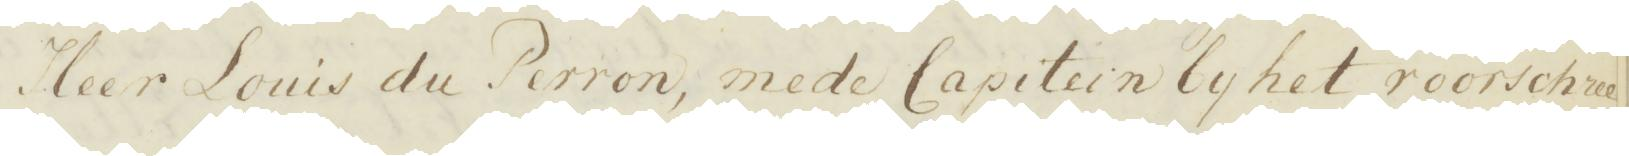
Heer Louis du Perron, mede Capitein by het voorschree
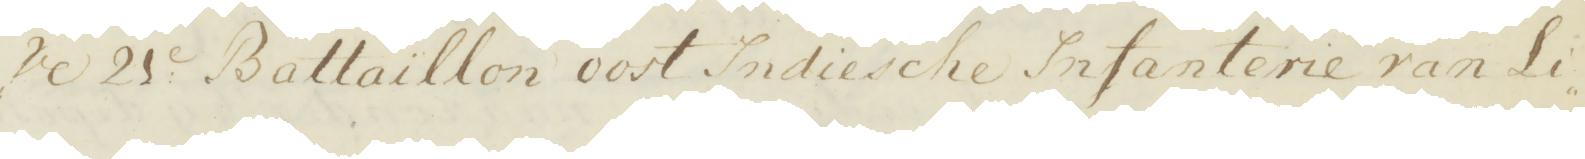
ve 21:e Battaillon Oost Indiesche Infanterie van Li„
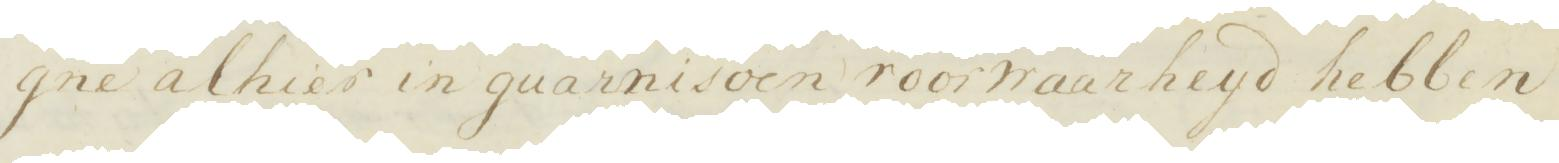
gne alhier in guarnisoen voor waarheyd hebben
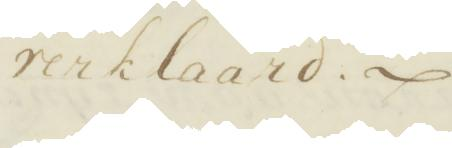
verklaard.—
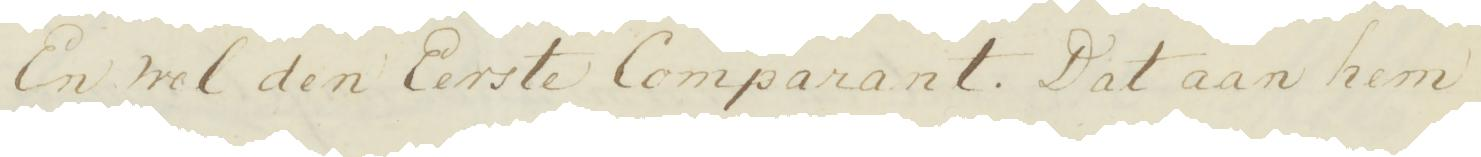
En wel den Eerste Comparant. Dat aan hem
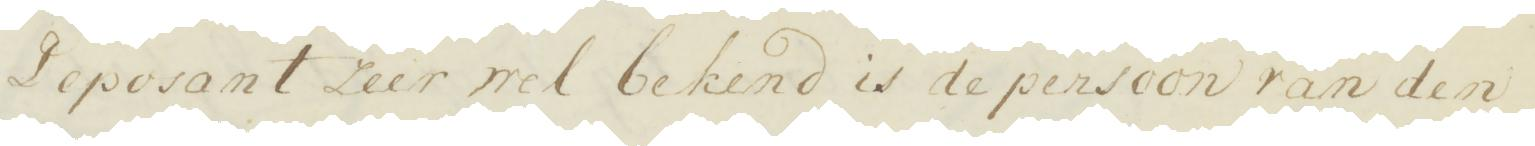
Deposant zeer wel bekend is de persoon van den
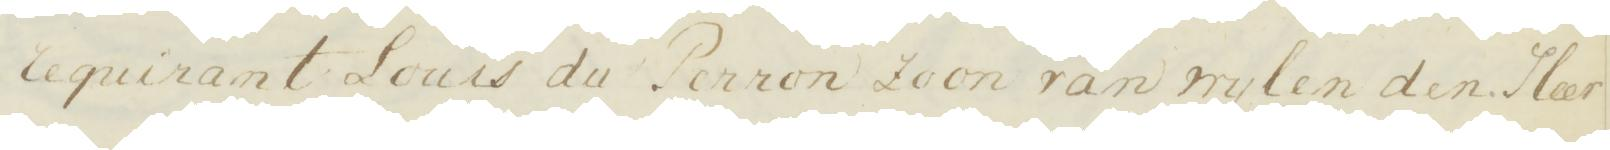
requirant Louis du Perron zoon van wylen den Heer
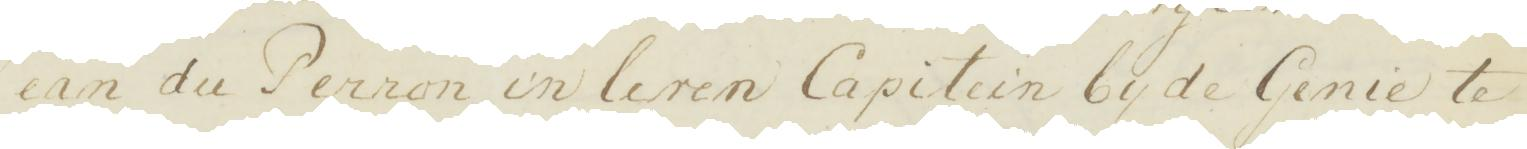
Jean du Perron in leven Capitein by de Genie te
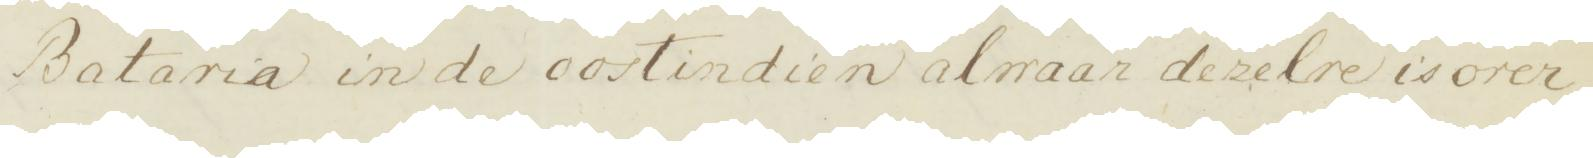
Batavia in de oostindien alwaar dezelve is over
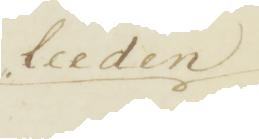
leeden
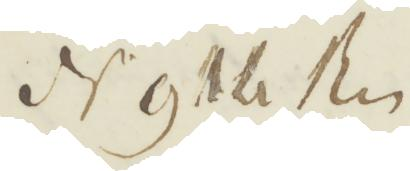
No 914 Rv
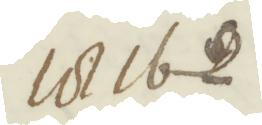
1816 2/3
